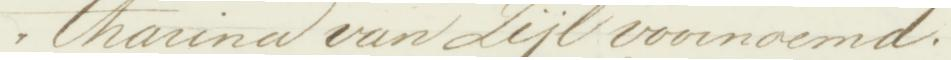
„tharina van Zijl voornoemd.
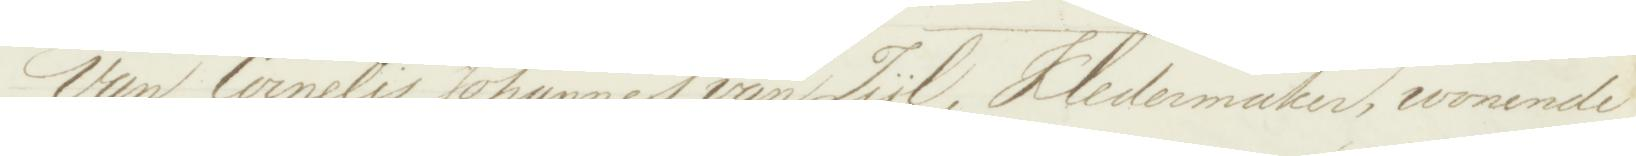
c. Van Cornelis Johannes van Zijl, Kledermaker, wonende
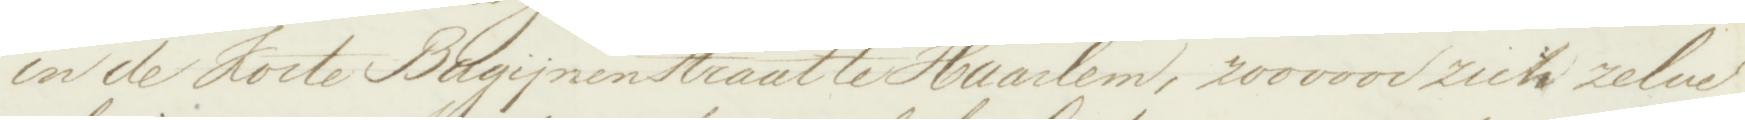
in de Korte Bagijnenstraat te Haarlem, zoo voor zich zelve
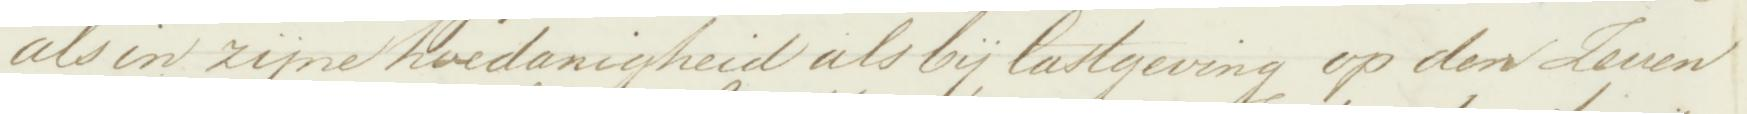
als in zijne hoedanigheid als bij lastgeving op den Zeven
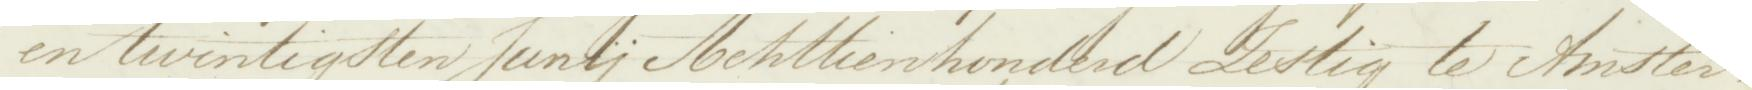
en twintigsten Junij Achttienhonderd Zestig te Amster„
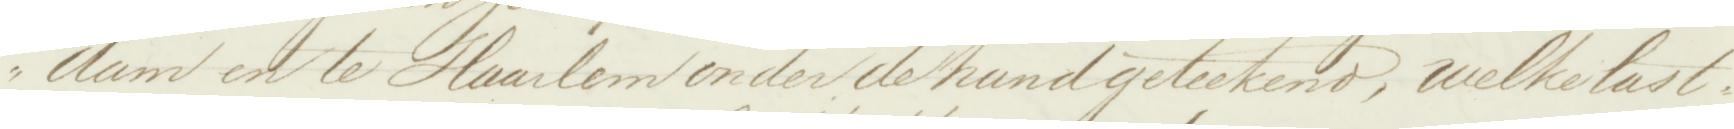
„dam en te Haarlem onder de hand geteekend, welke last„
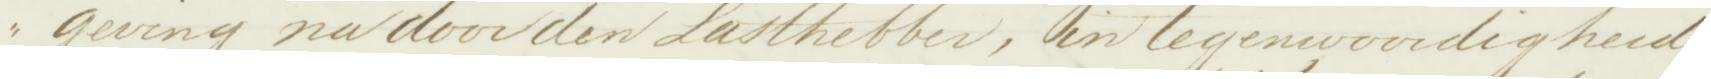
„geving na door den Lasthebber, in tegenwoordigheid
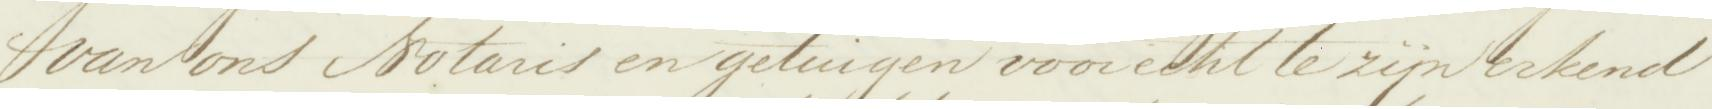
van ons Notaris en getuigen voor echt te zijn erkend
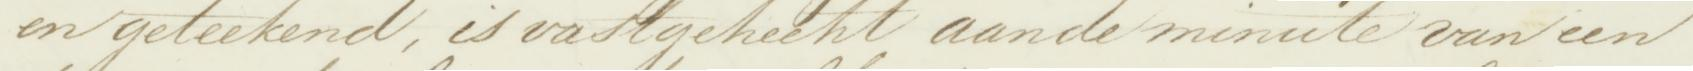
en geteekend, is vastgehecht aan de minute van een
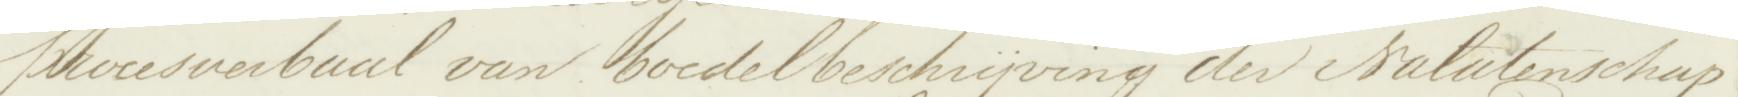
procesverbaal van boedelbeschrijving der Nalatenschap
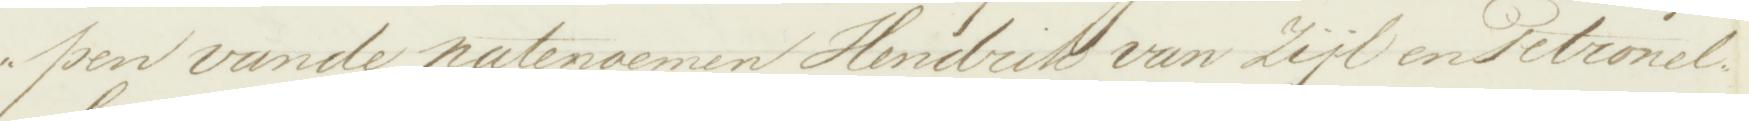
„pen van de natenoemen Hendrik van Zijl en Petronel„
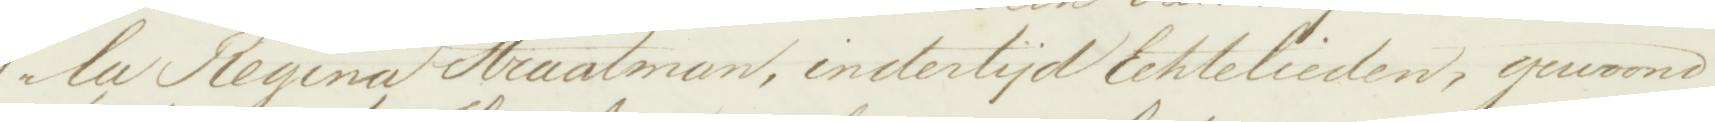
„la Regina Straatman, indertijd Echtelieden, gewoond
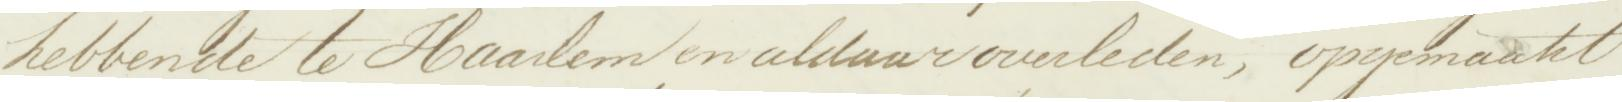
hebbende te Haarlem en aldaar overleden, opgemaakt
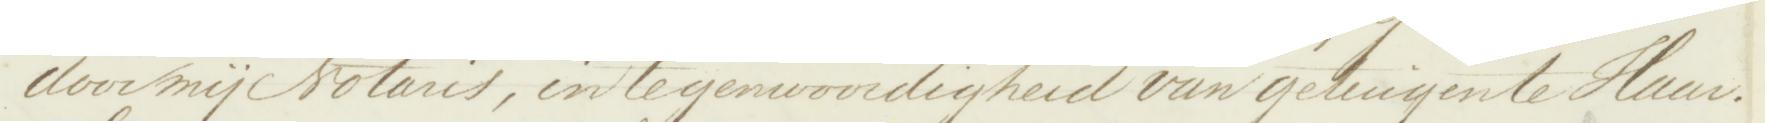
door mij Notaris, in tegenwoordigheid van getuigen te Haar„
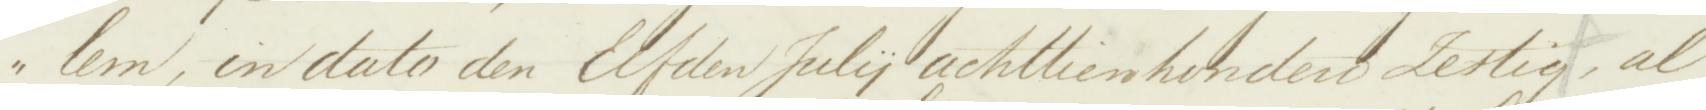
„lem, in dato den Elfden Julij achttien honderd Zestig, al
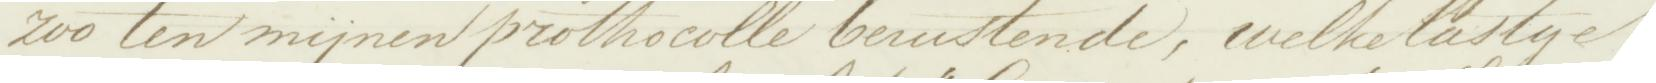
zoo ten mijnen prothocolle berustende, welke lastge
